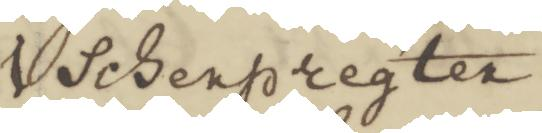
1 scherpregter
